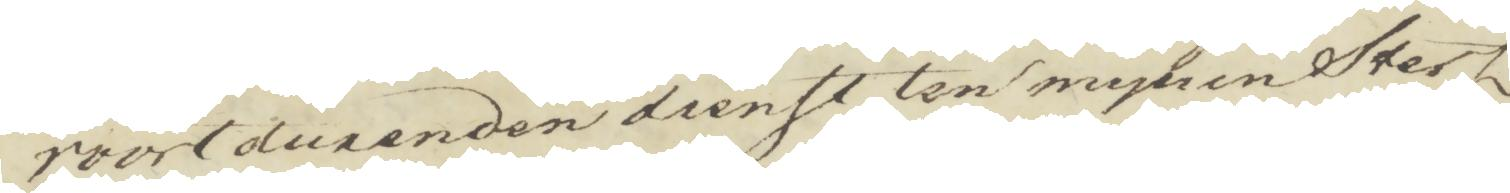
voortdurenden dienst ten mynen sterf
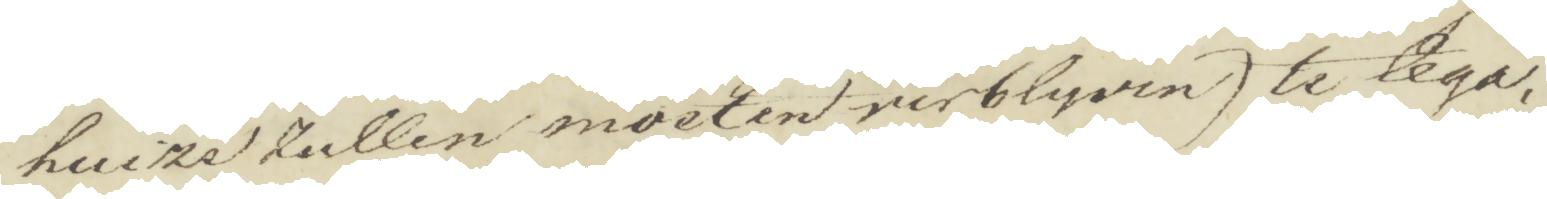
huize zullen moeten verblyven te lega„
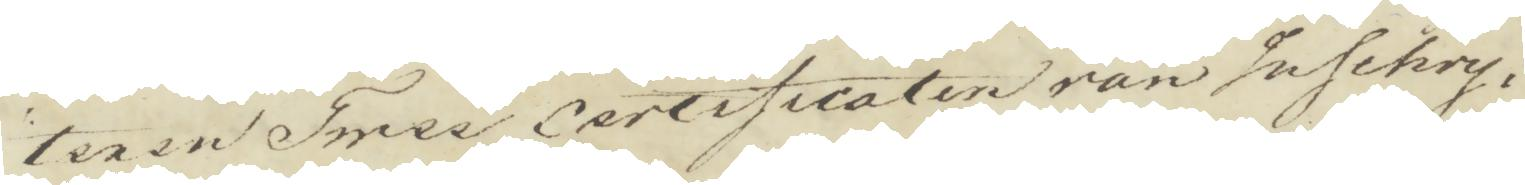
teren Twee certificaten van Inschry„
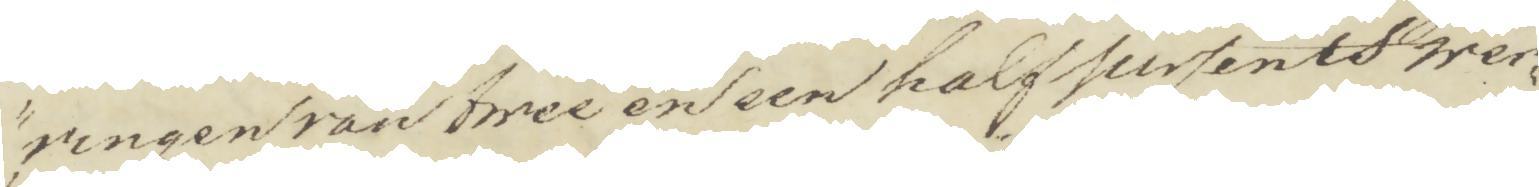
„vingen van twee en een half percents wer„
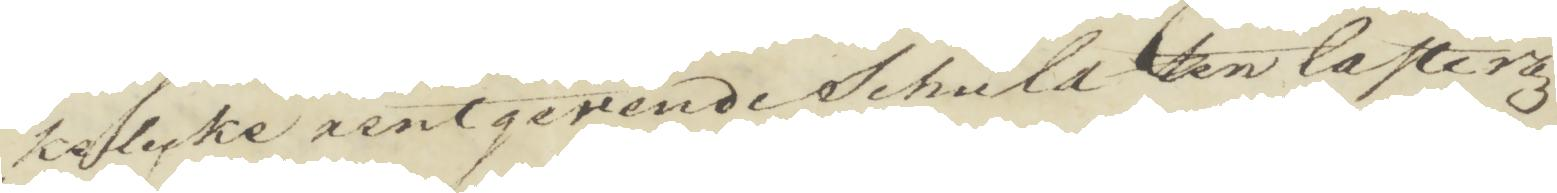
kelyke rentgevende schuld ten laste van
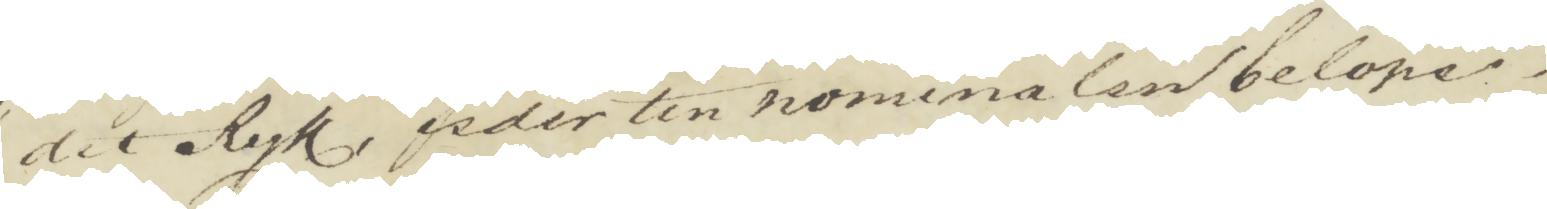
dit Rijk, ieder ten nomina len belope
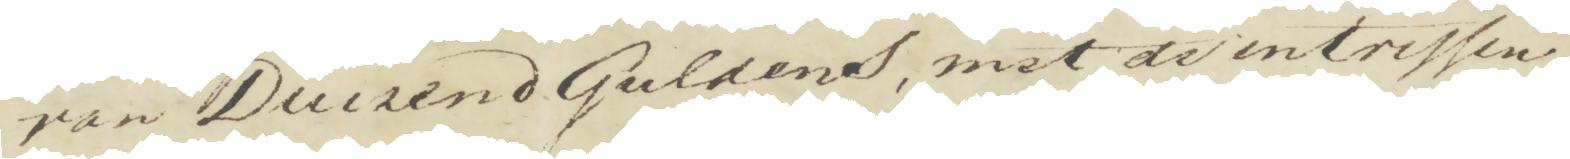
van Duizend Guldens, met de intressen
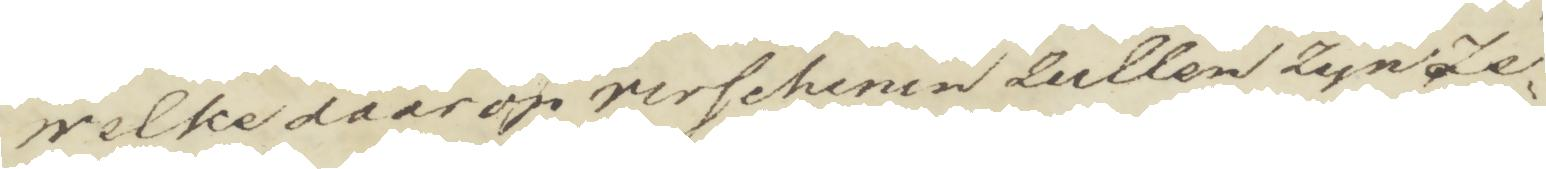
welke daar op verschenen zullen zyn ze„
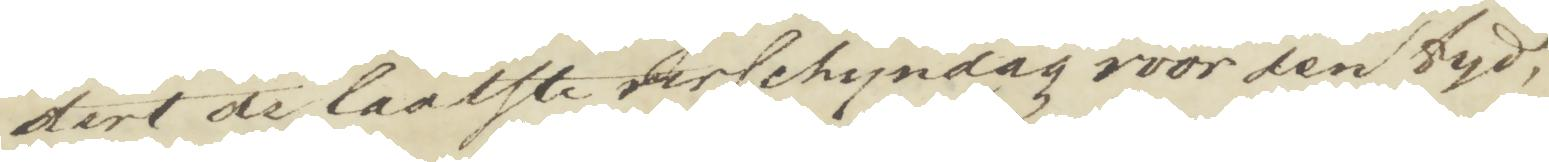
dert de laatste verschyndag vóór den tijd,
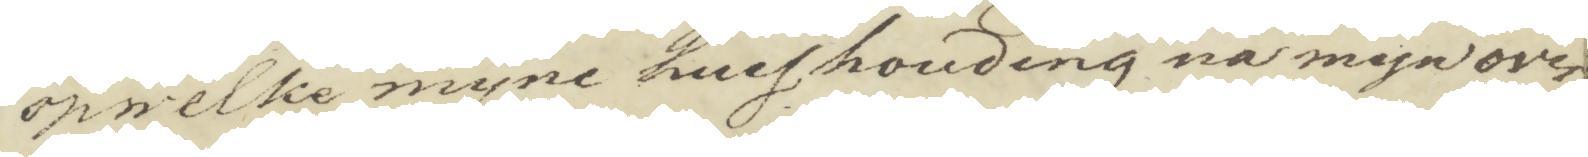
opwelke myne huishouding na myn over
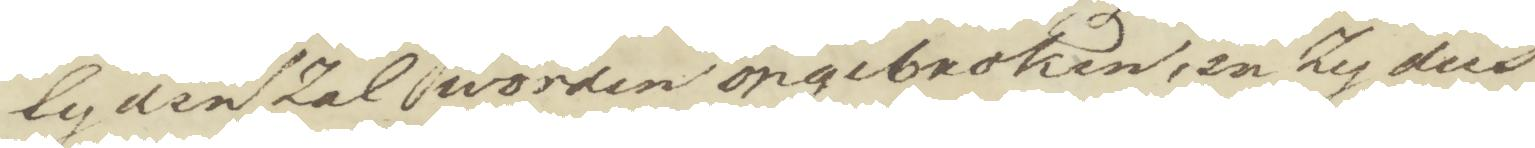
lyden zal worden opgebroken, en zy dus
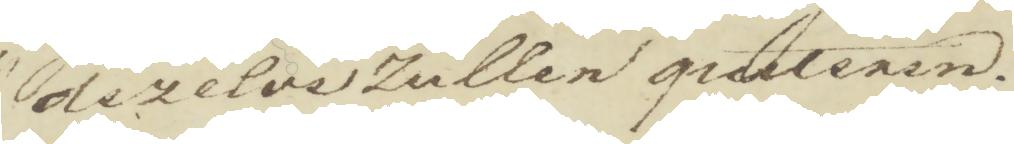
dezelve zullen quiteren.
